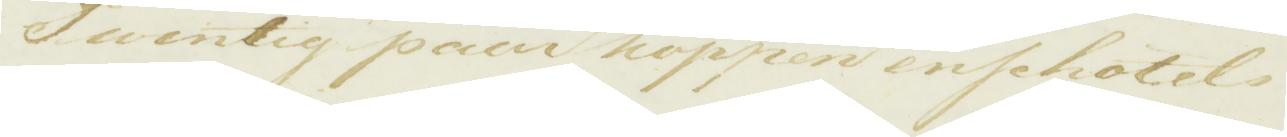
Twintig paar koppen en schotels
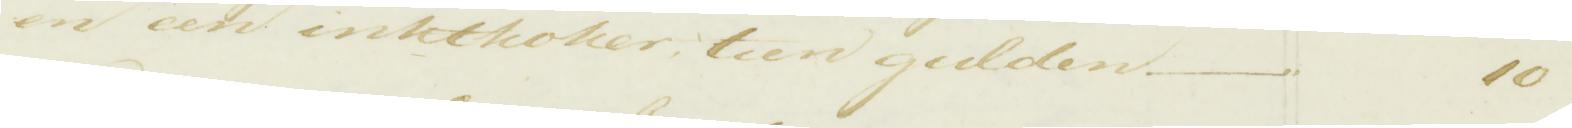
en een inktkoker, tien gulden ——— „ 10
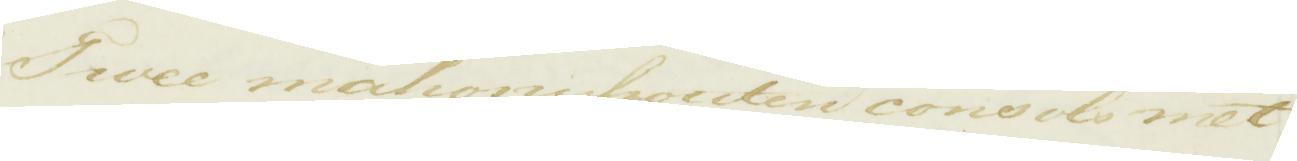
Twee mahonyhouten consols met
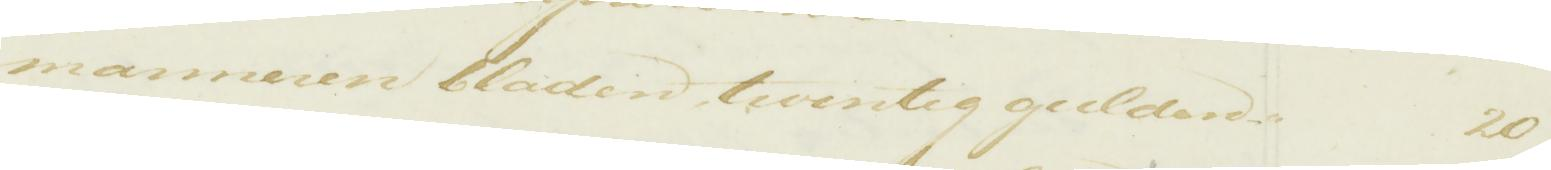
marmeren bladen, twintig gulden „ 20
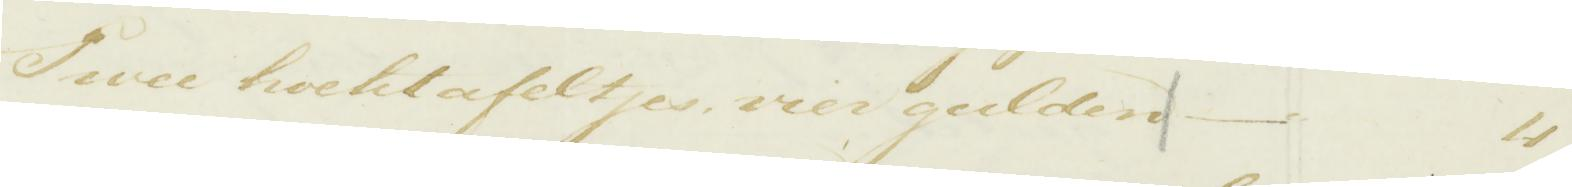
Twee hoektafeltjes, vier gulden/—— „ 4
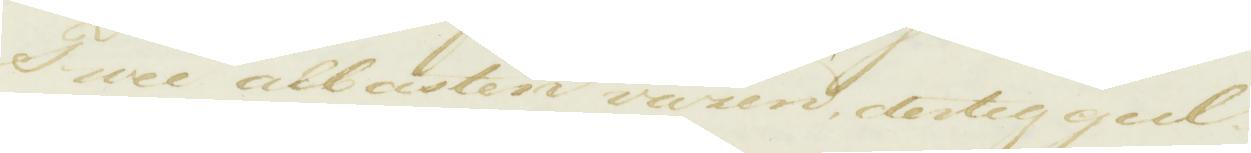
Twee albasten vazen, dertig gul
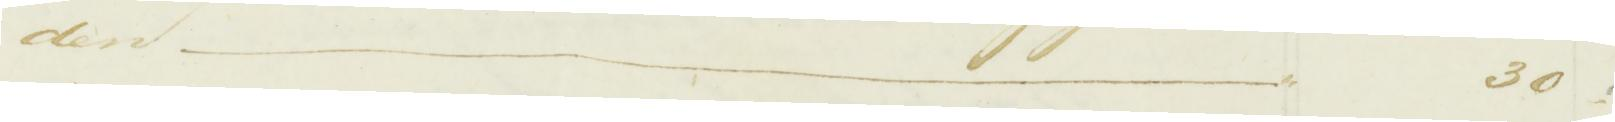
den ————————————— „ 30
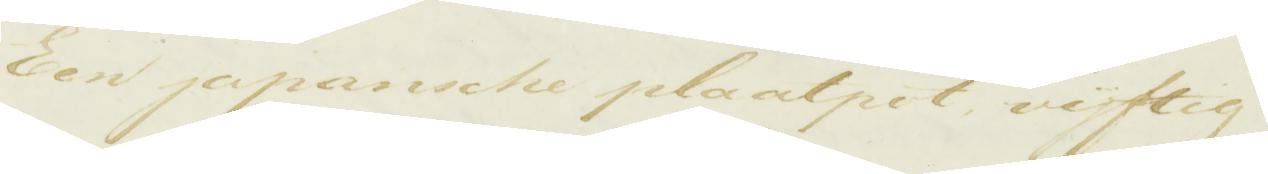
Een japansche plaatpot, vijftig
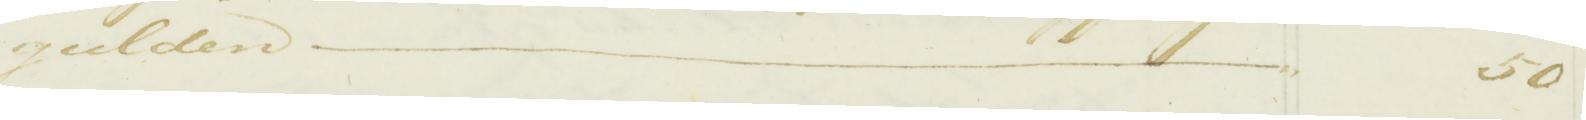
gulden ——————————— „ 50
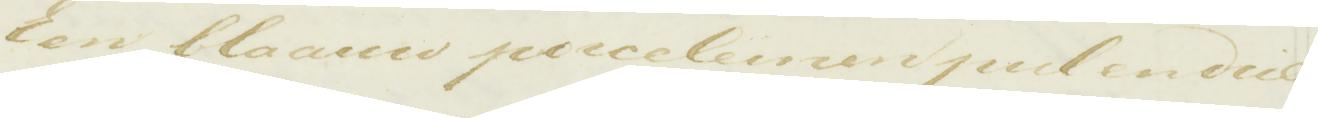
Een blaauw porceleinen pul en drie
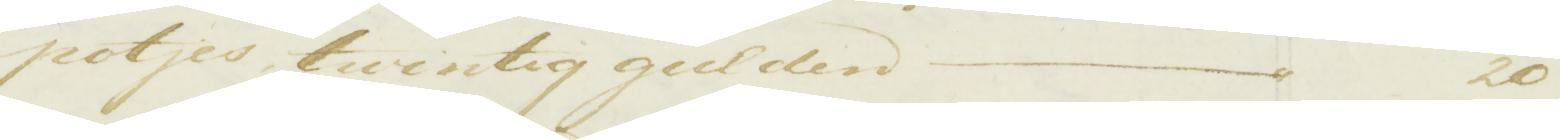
potjes, twintig gulden ———— „ 20
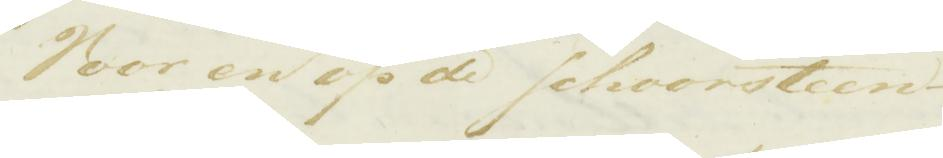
Voor en op de schoorsteen.
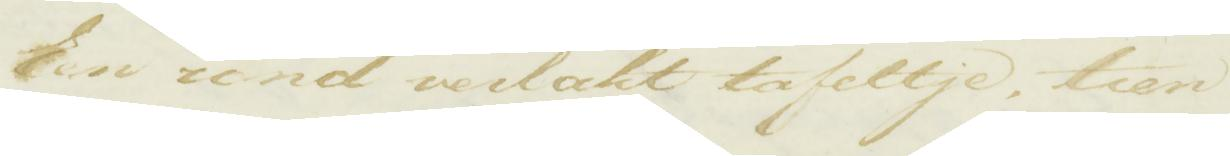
Een rond verlakt tafeltje, tien
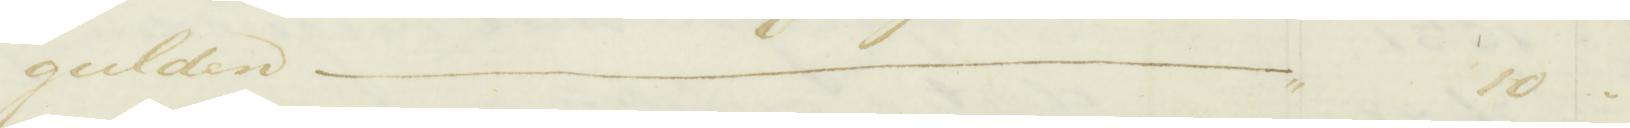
gulden ——————————— „10
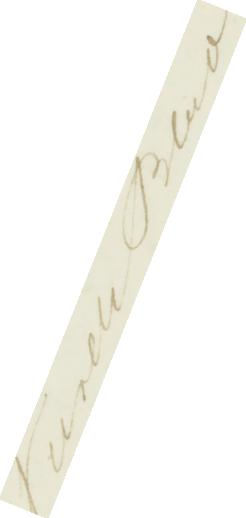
Vierde Blad
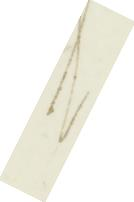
E
